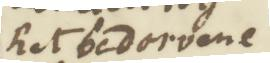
het bedorvene
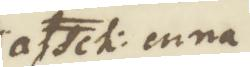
afsch: en na
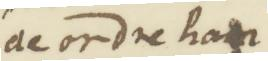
de ordre han
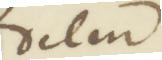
delen
